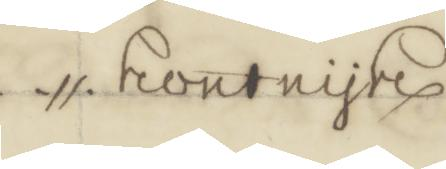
. „ . kortrijk
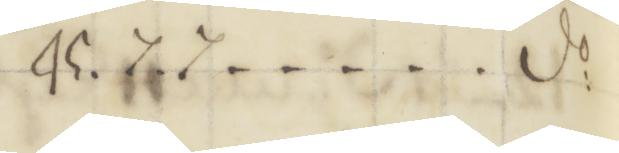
45. 7. 7. . . . . d:o
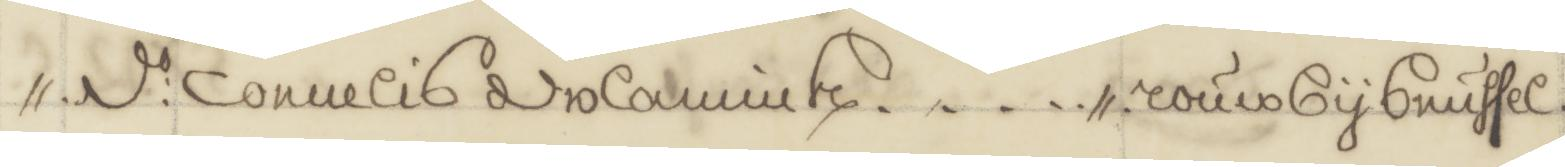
„ . d:o Cornelis de vlamink . . . . . . „ . rouw bij brussel
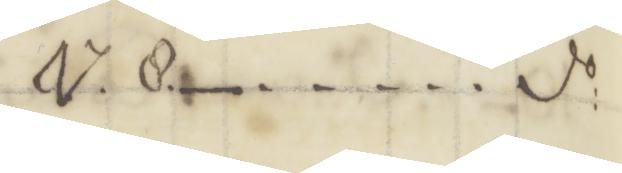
47. 8. — . . . . . d:o
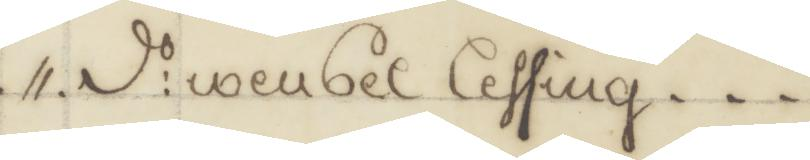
„ . d:o wenbel tessing - - -
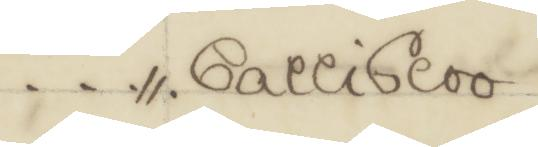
- - . „ . balliscoo
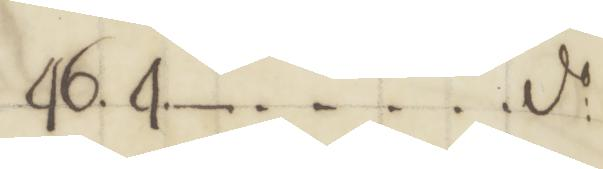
46. 4.— . . . . . d:o
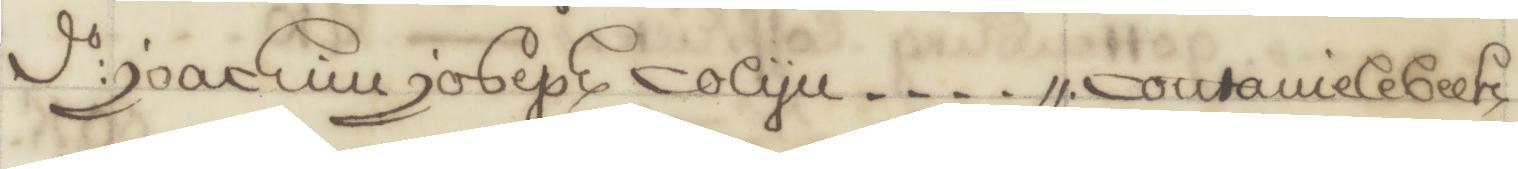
d:o joachim joseph colijn - - - - „ . contanielebeek
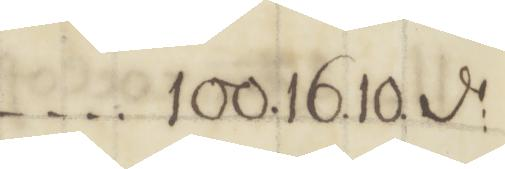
- - - . 100.16.10. d:o
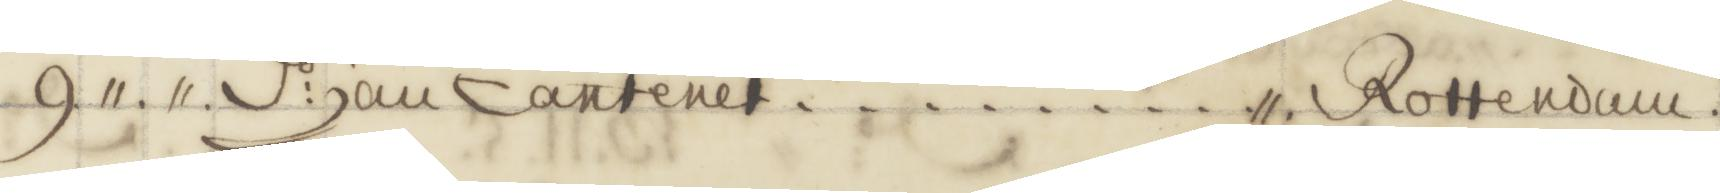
9. „ . „ . d:o jan carteret . . . . . . . . . „ . Rotterdam
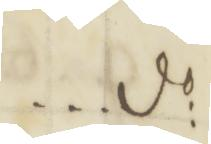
. . . d:o
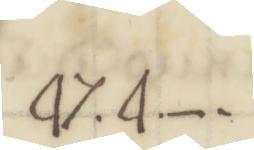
47.4
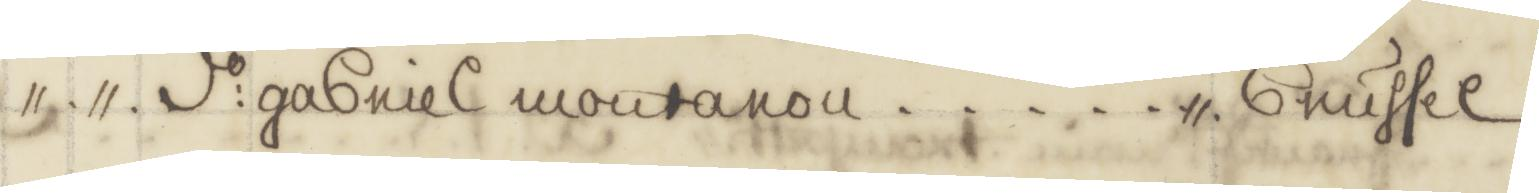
„ . „ . d:o gabriel montarou . . . . . .„. brussel
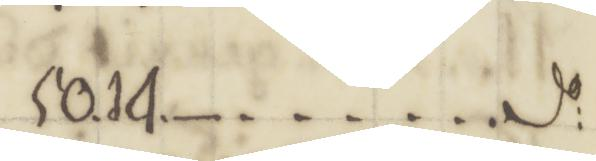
50.14.— . . . . . . d:o
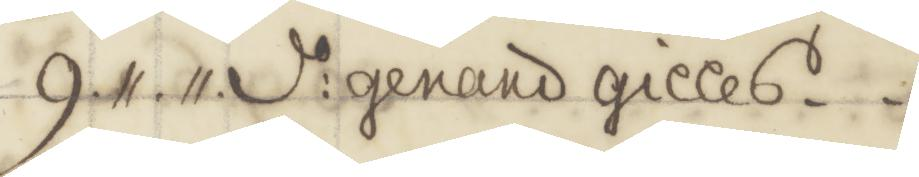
9. „ . „ . d:o gerard gilles - -
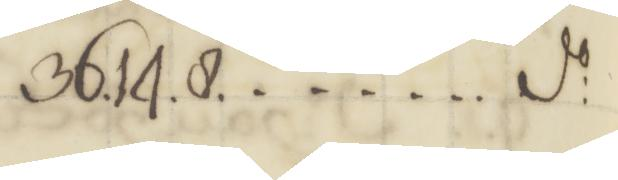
_:o 36.14.8. - - - - - . d:o
